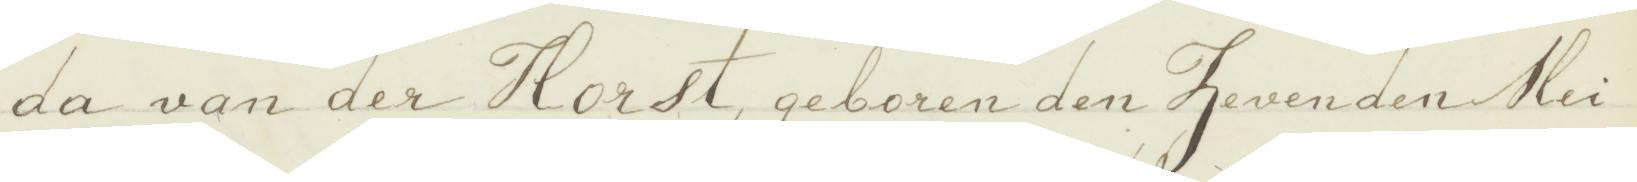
da van der Horst, geboren den Zevenden Mei
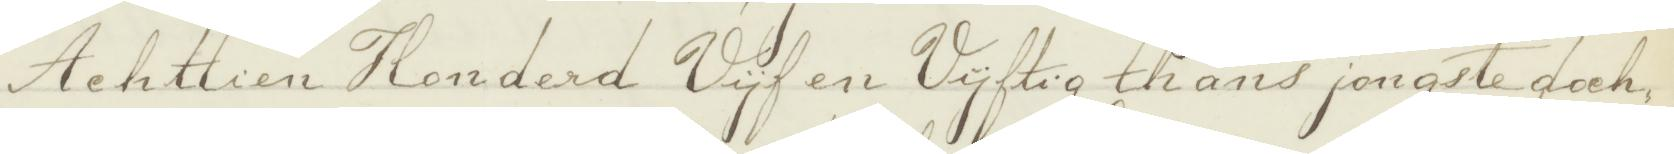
Achttien Honderd Vijf en Vijftig thans jongste doch„
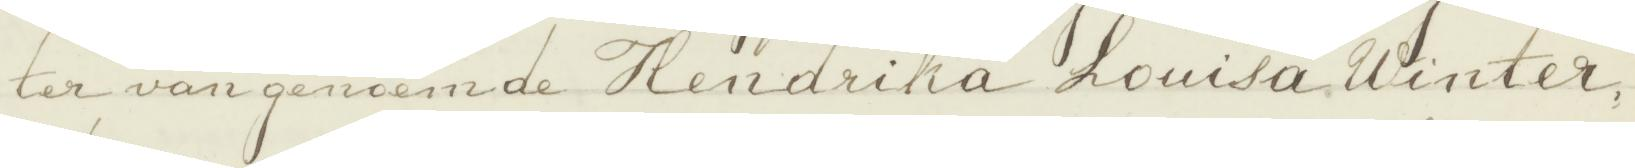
ter van genoemde Hendrika Louisa Winter„
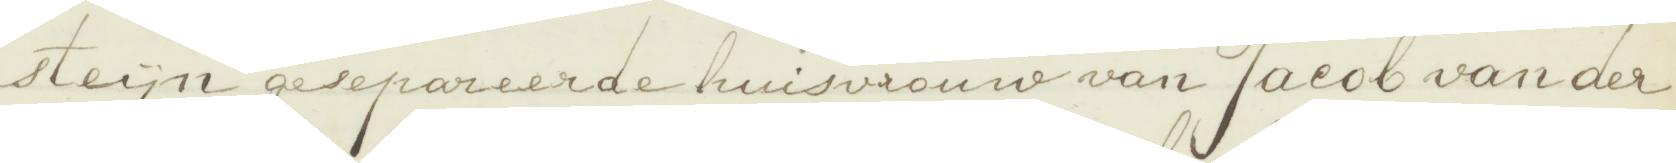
steijn gesepareerde huisvrouw van Jacob van der
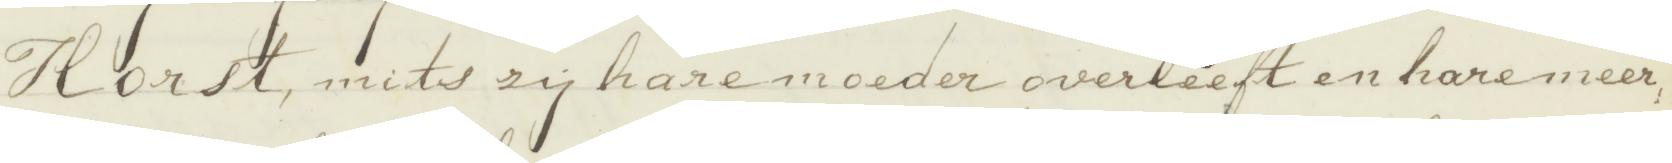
Horst, mits zij hare moeder overleeft en hare meer„
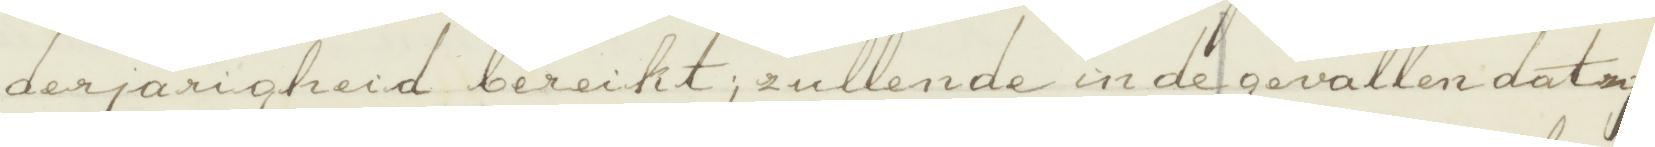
derjarigheid bereikt; zullende in de gevallen dat zij
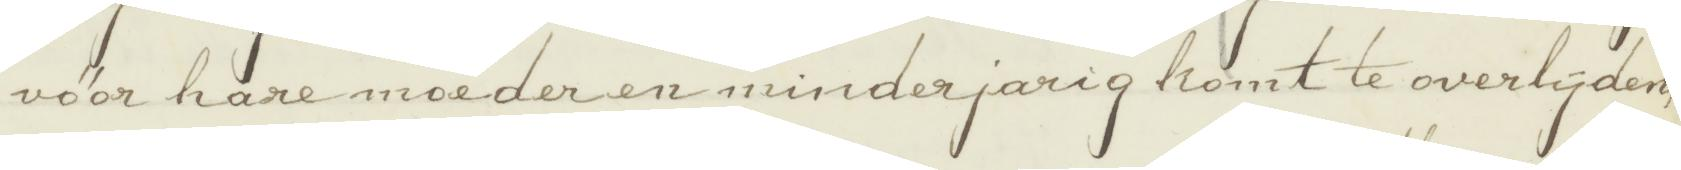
vóór hare moeder en minderjarig komt te overlijden,
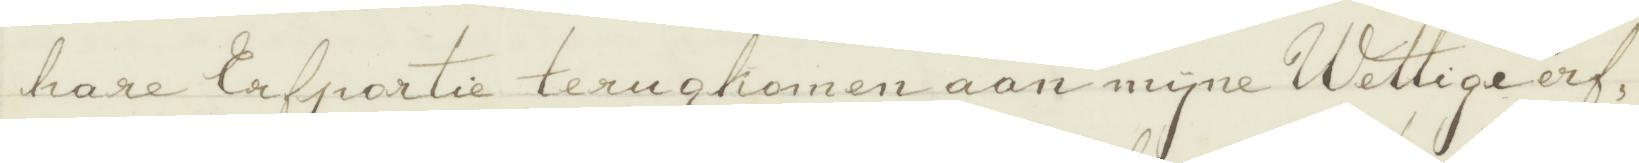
hare Erfportie terugkomen aan mijne Wettige erf„
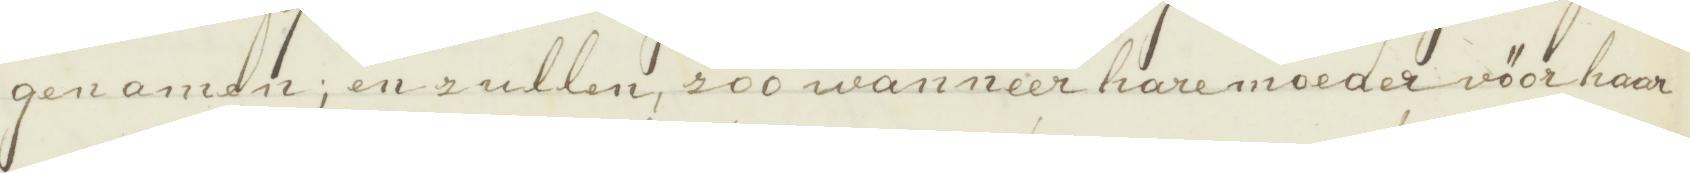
genamen; en zullen, zoo wanneer hare moeder vóór haar
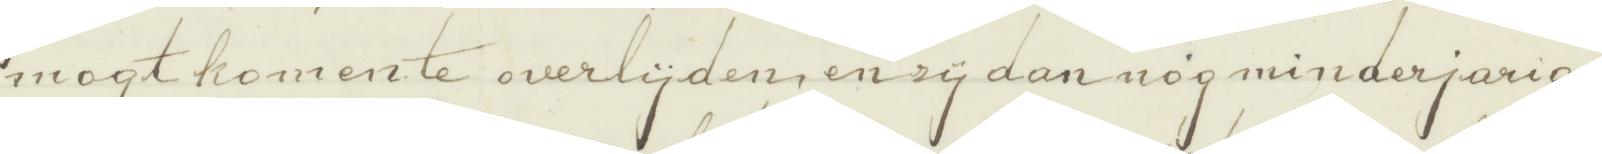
mogt komen te overlijden, en zij dan nog minderjarig
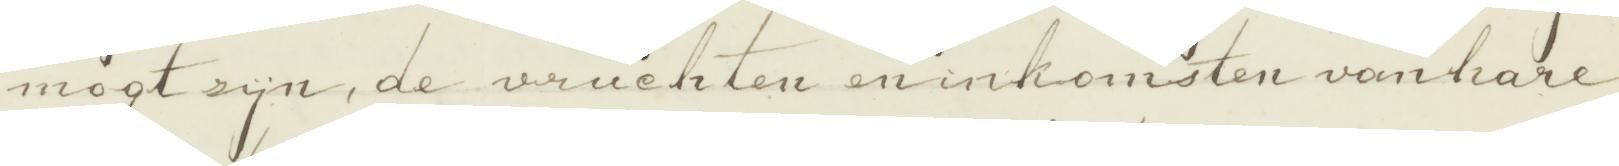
mogt zijn, de vruchten en inkomsten van hare
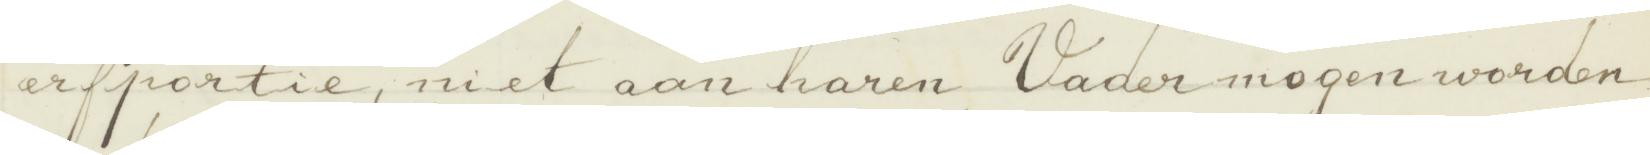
erfportie, niet aan haren Vader mogen worden
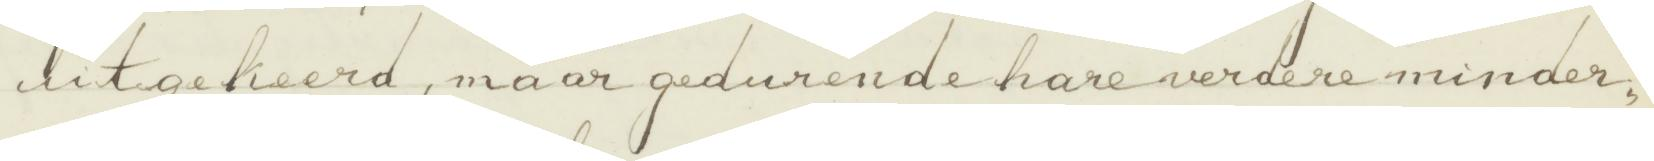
uitgekeerd, maar gedurende hare verdere minder„
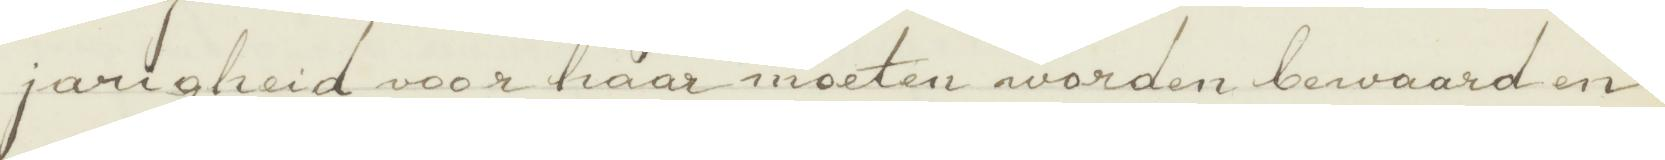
jarigheid voor haar moeten worden bewaard en
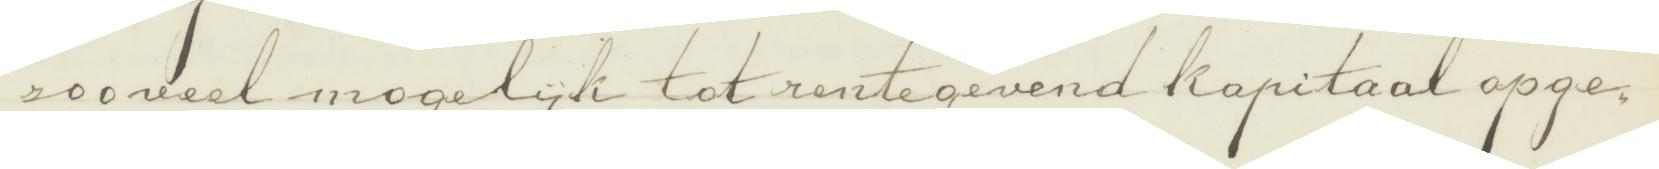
zoo veel mogelijk tot rentegevend kapitaal opge„
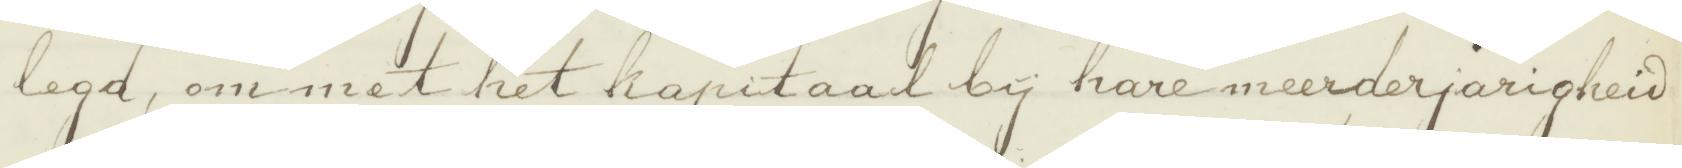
legd, om met het kapitaal bij hare meerderjarigheid
